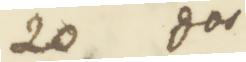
20 d:os
